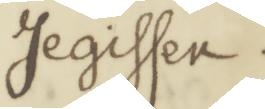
Jegisser
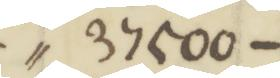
„ 37500
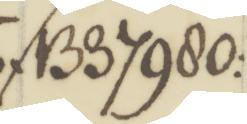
ƒ1337980:
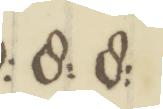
8: 8:
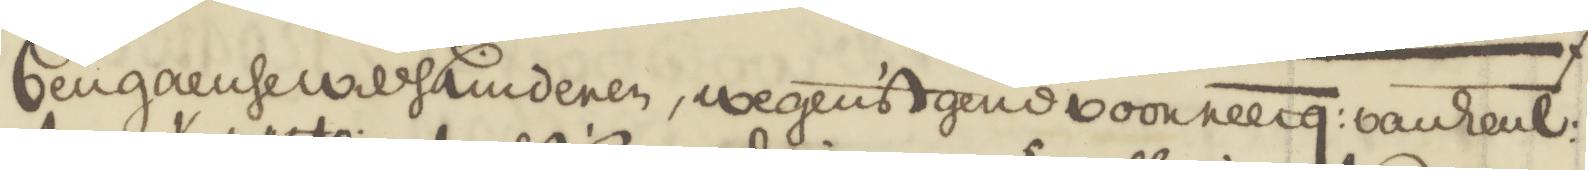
bengaense weeskinderen, wegens't gene voor reecq: van heul:
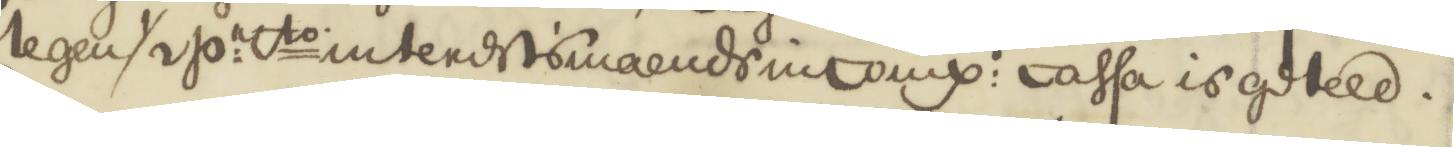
tegen ½ p:r c=to interest 'smaends in comp:s cassa is geteld .
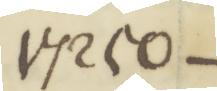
17250 –
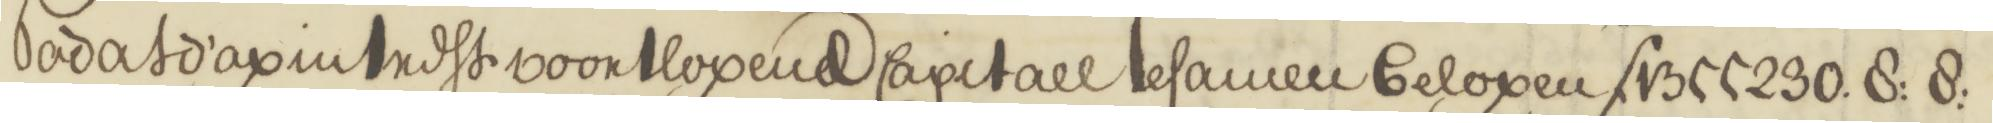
sodat d'op intrest voortlopende Capitael tesamen belopen ƒ1355230. 8: 8:
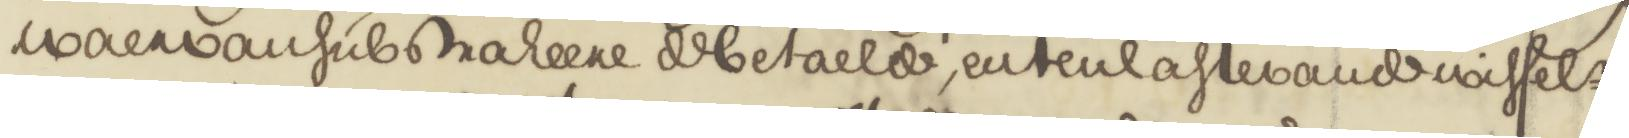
waervan substraheere de betaelde, en ten laste van de wissel=rs
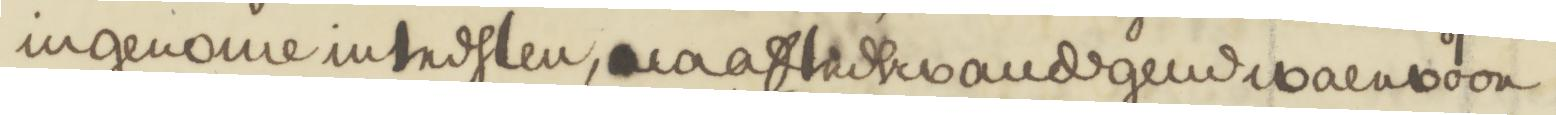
ingenome intresten, na aftrek van de gene waervoor
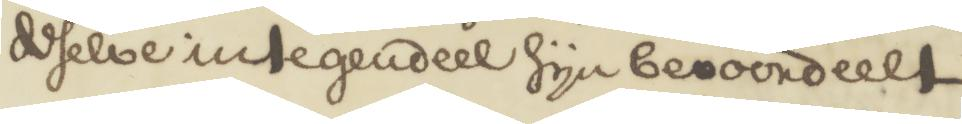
deselve in tegendeel sijn bevoordeelt
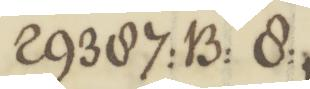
29387:13: 8:
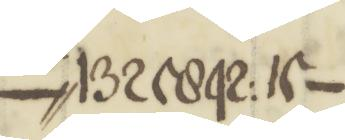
„1325842:15
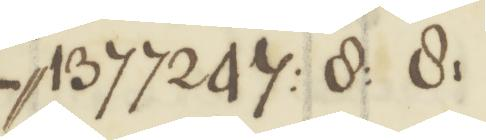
„1377247:8: 8:
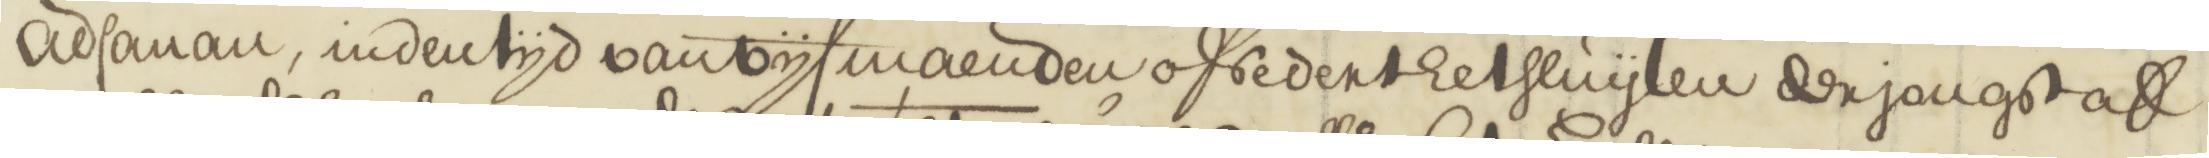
adsanan, inden tijd van vijf maenden of sedert het sluijten der jongst af
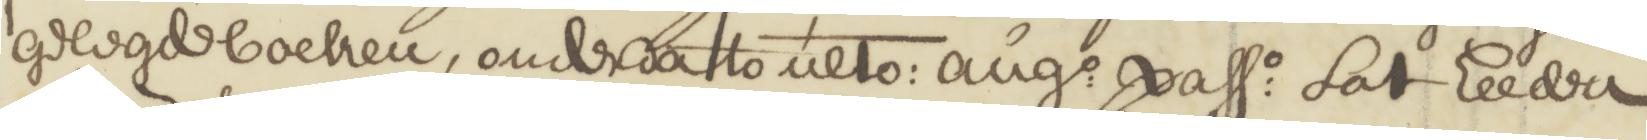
gelegde boeken, onder dato ulto: aug:o pass:o tot heeden
